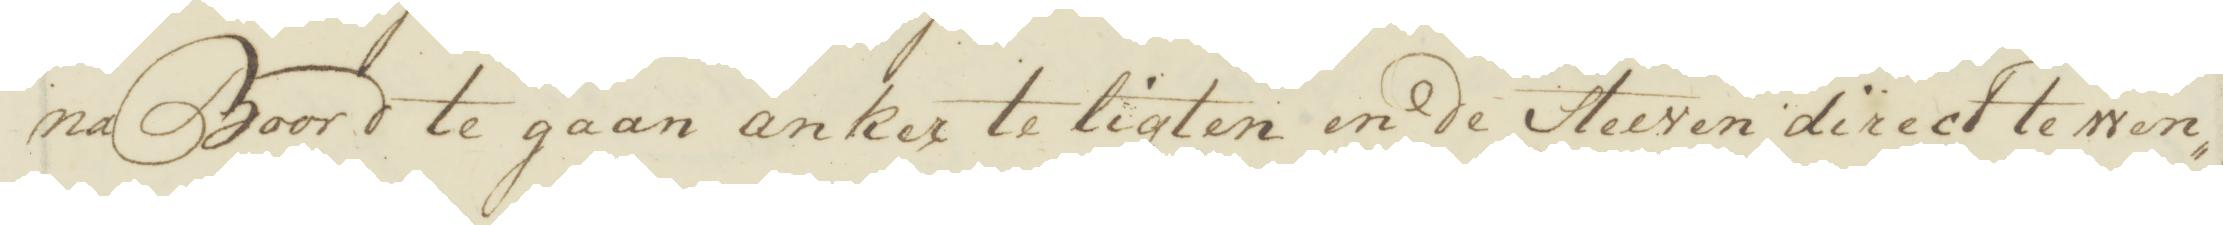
na Boord te gaan anker te ligten en de steeven direct te wen„
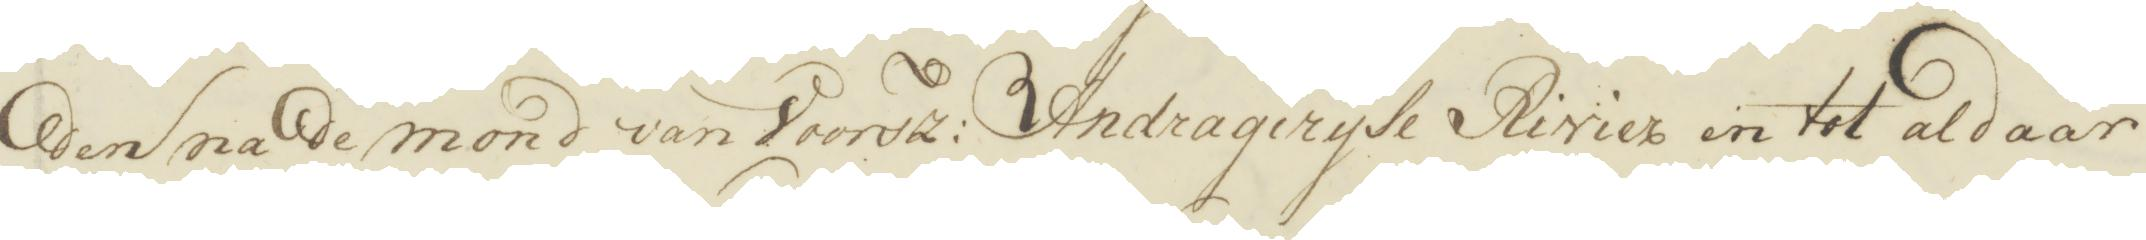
den na de mond van Voorsz: Andragirijse Rivier en tot aldaar
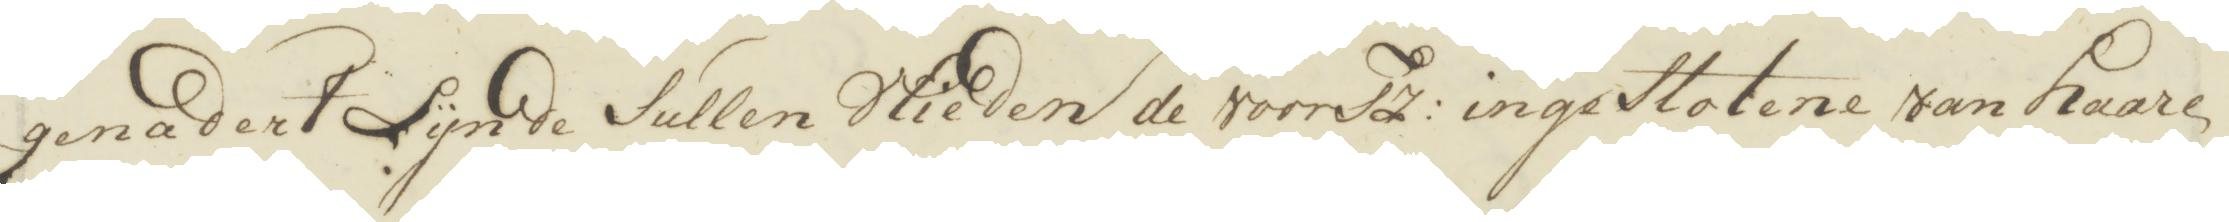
genadert sijnde sullen vlieden de voorsz: ingeslotene van haare
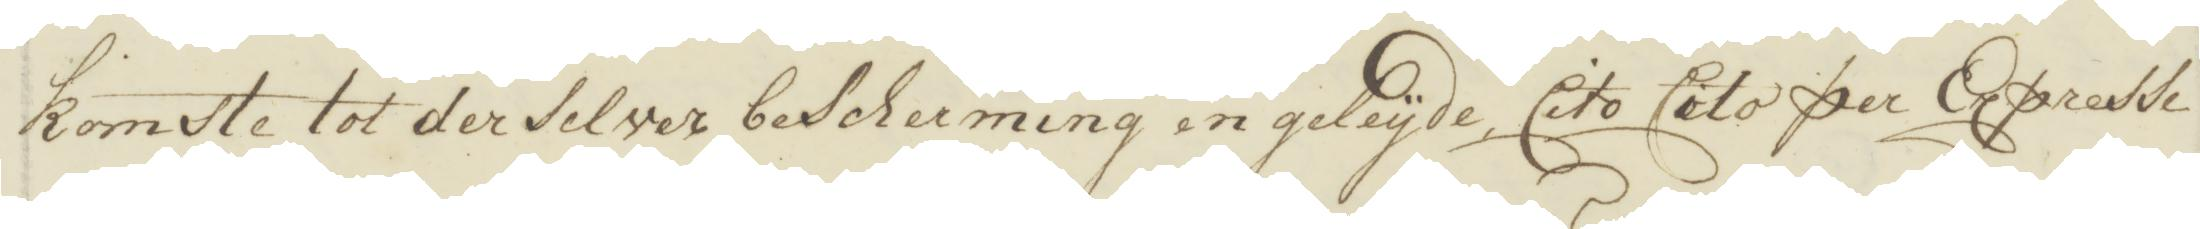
komste tot der selver bescherming en geleijde, Cito Cito per Expresse
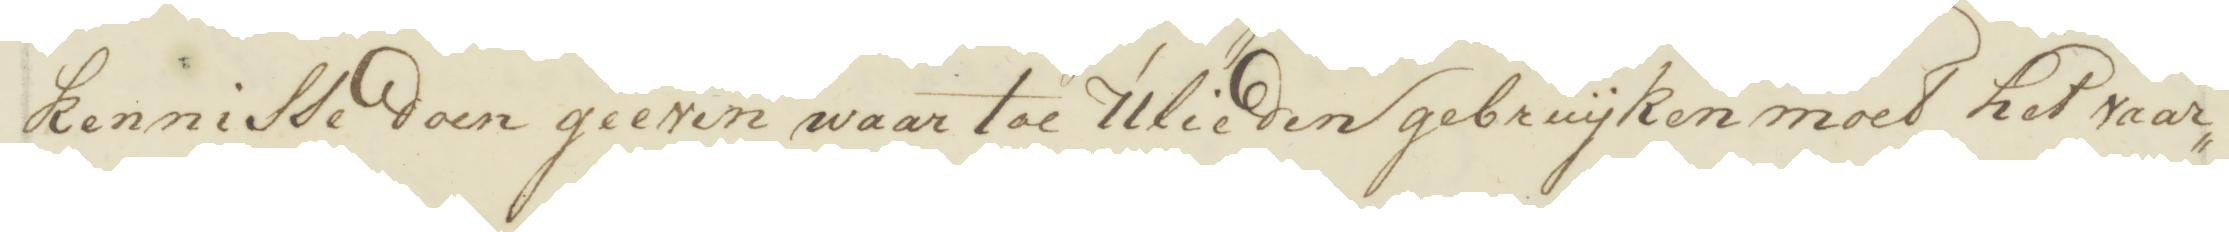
kennisse doen geeven waar toe ulieden gebruijken moet het vaar„
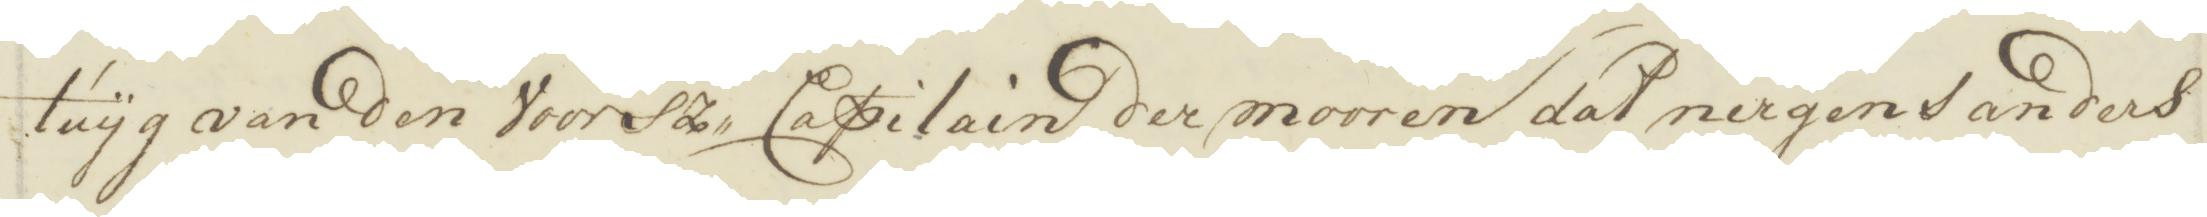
tuijg van den voorsz„n Capitain der mooren dat nergens anders
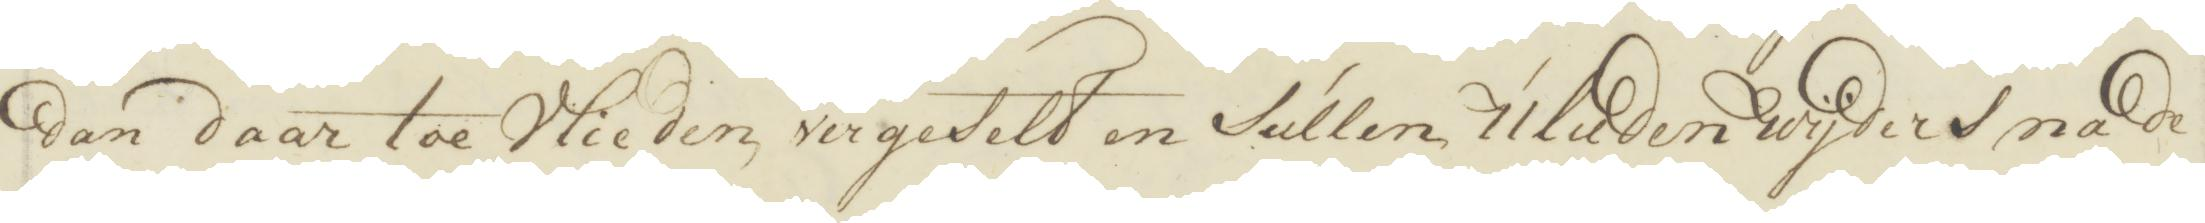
dan daar toe Vlieden, vergeselt en sullen ulieden wijders na de
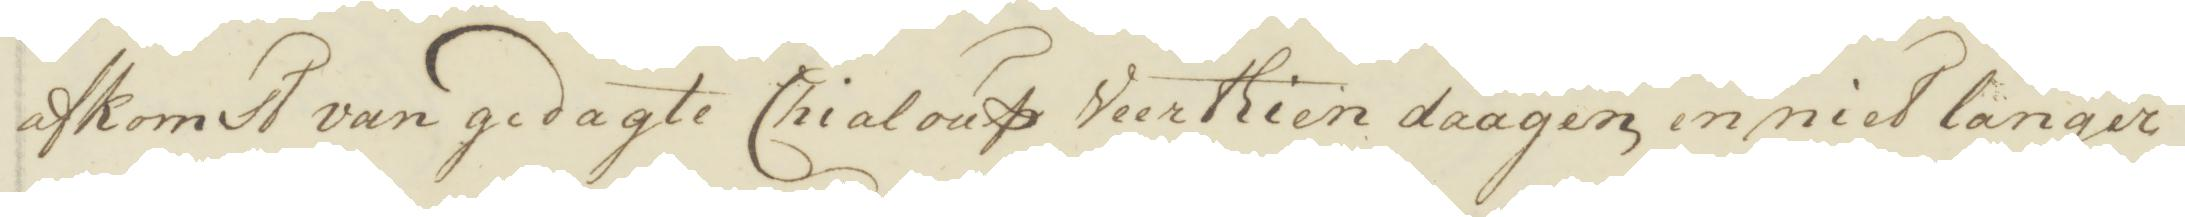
afkomst van gedagte Chialoup veerthien daagen en niet langer
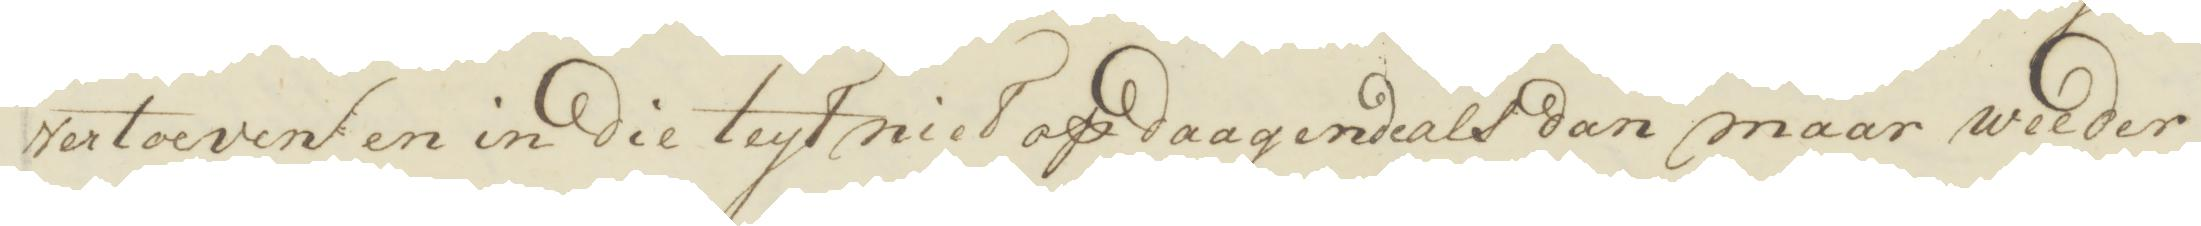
vertoeven en in die teyt niet opdaagende als dan maar weeder
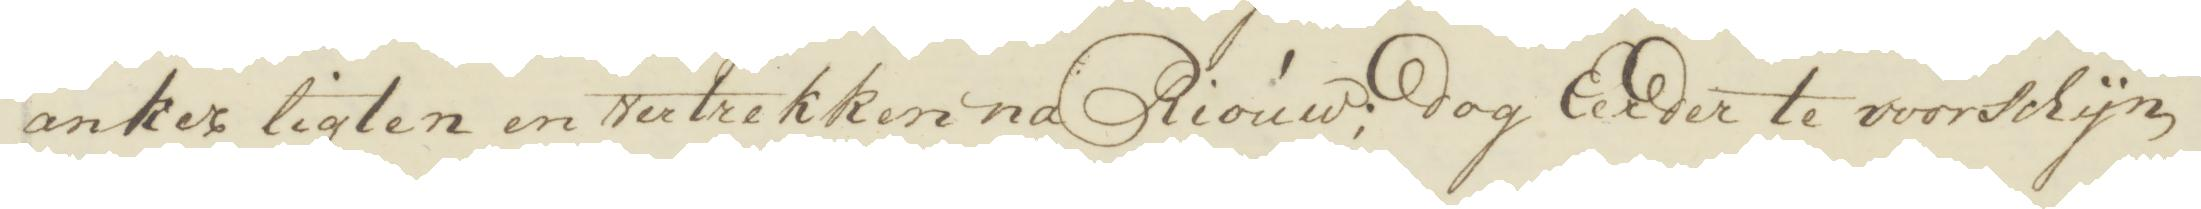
anker ligten en vertrekken na Riouw; dog Eerder te voorschijn
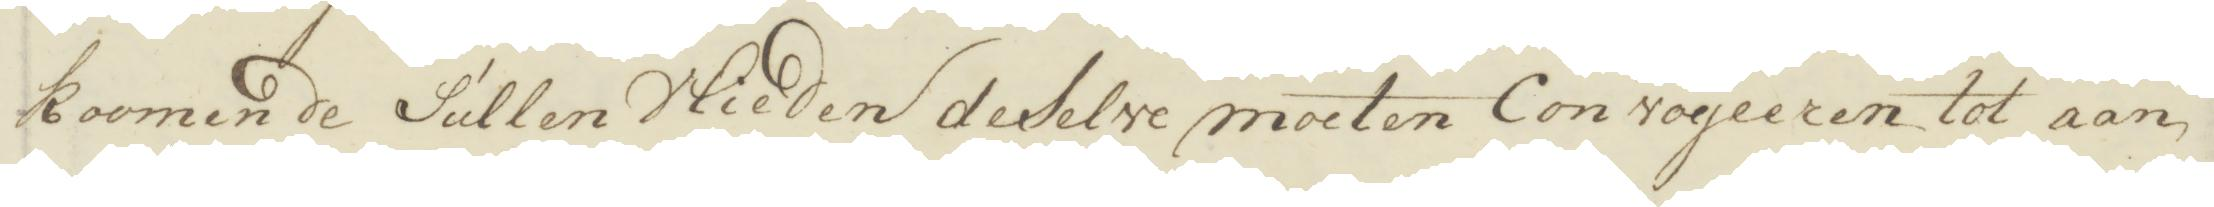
koomende sullen Vlieden deselve moeten convoijeeren tot aan
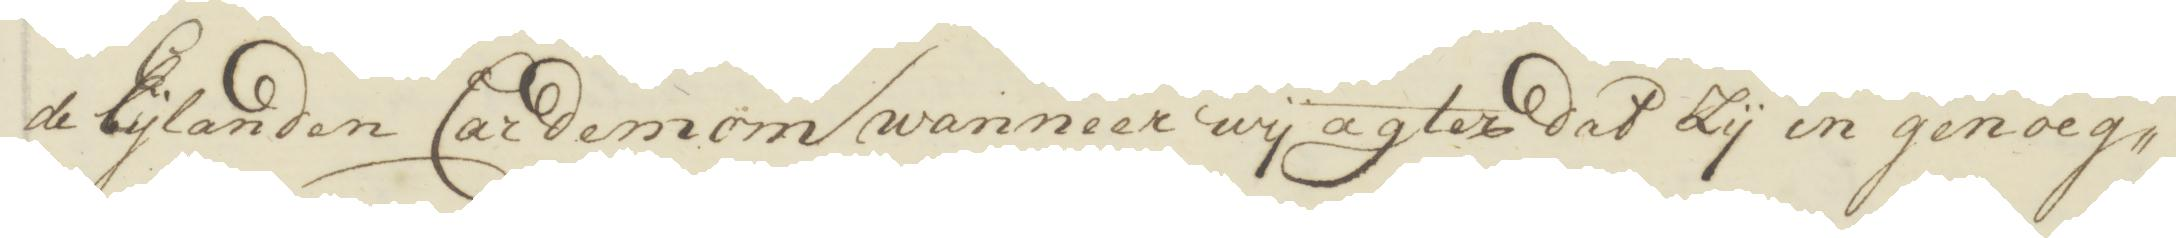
de Eijlanden Cardemom wanneer wij agter dat zij in genoeg„
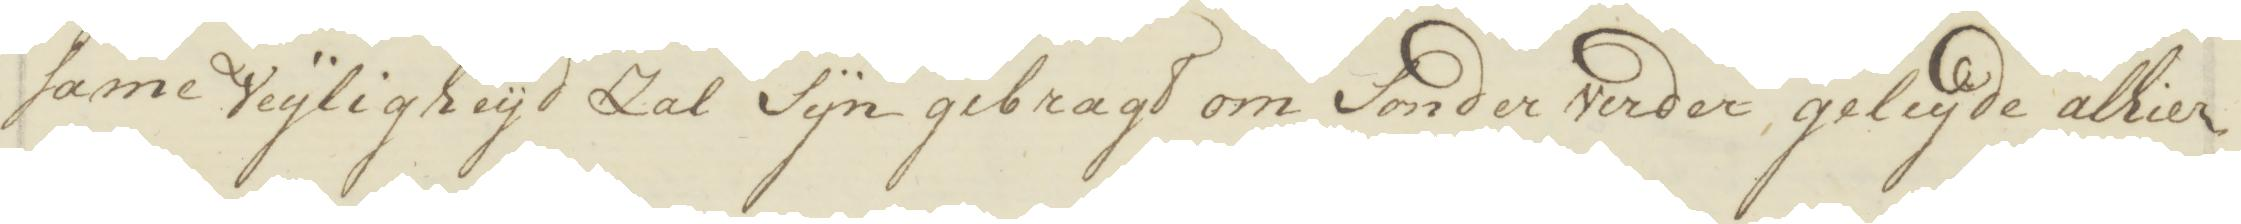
same Veijligheijd zal sijn gebragt om sonder verder geleijde alhier
